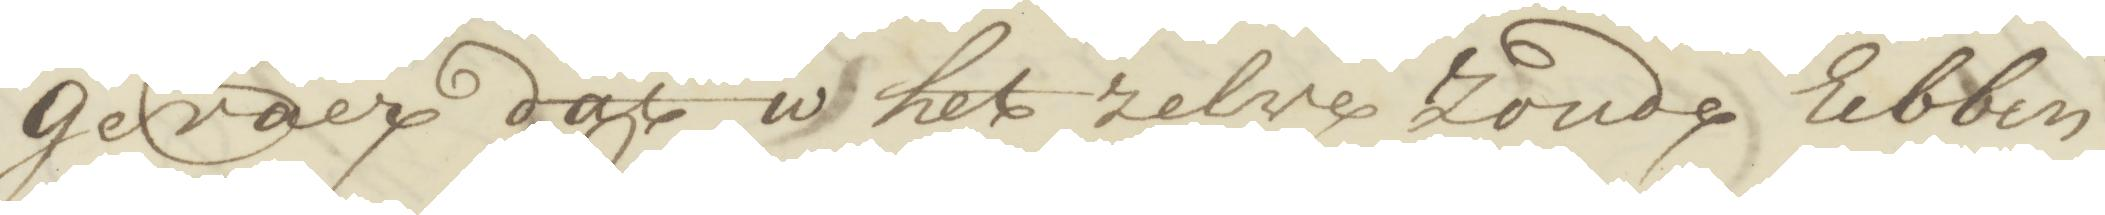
gevaer dat w het zelve Zoude hebben,
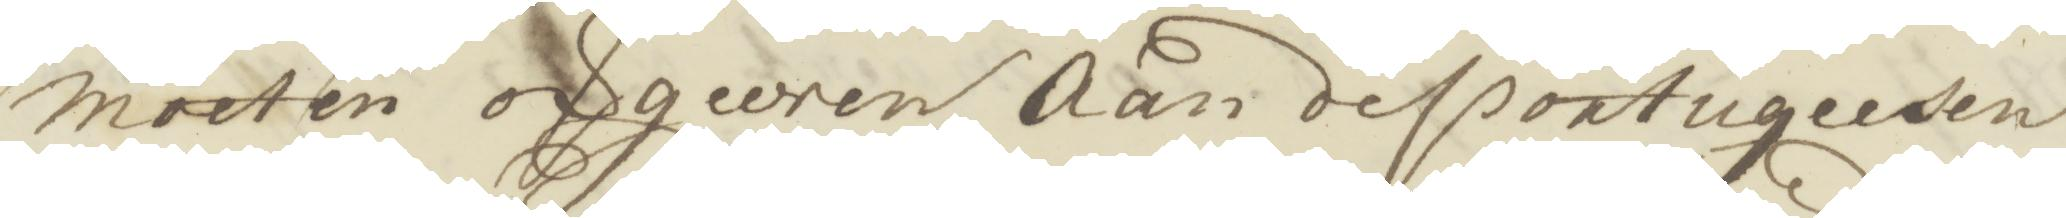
moeten overgeeven aan de portugeesen
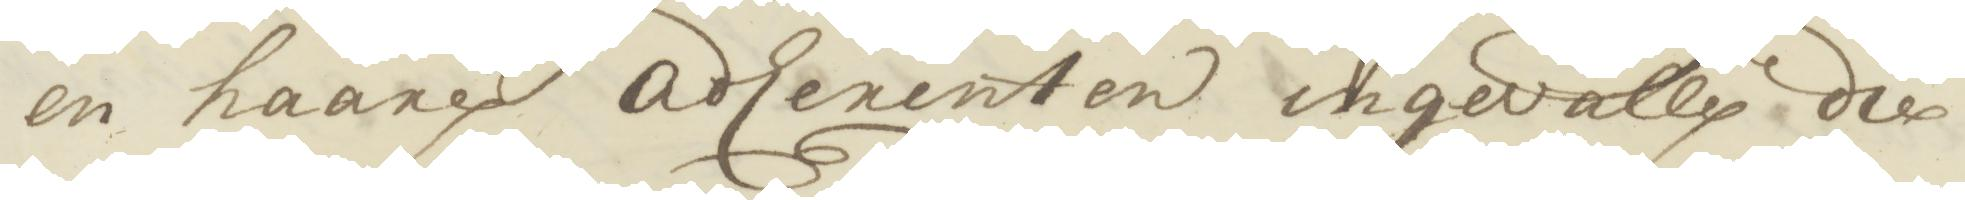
en haare adherenten ingevalle die
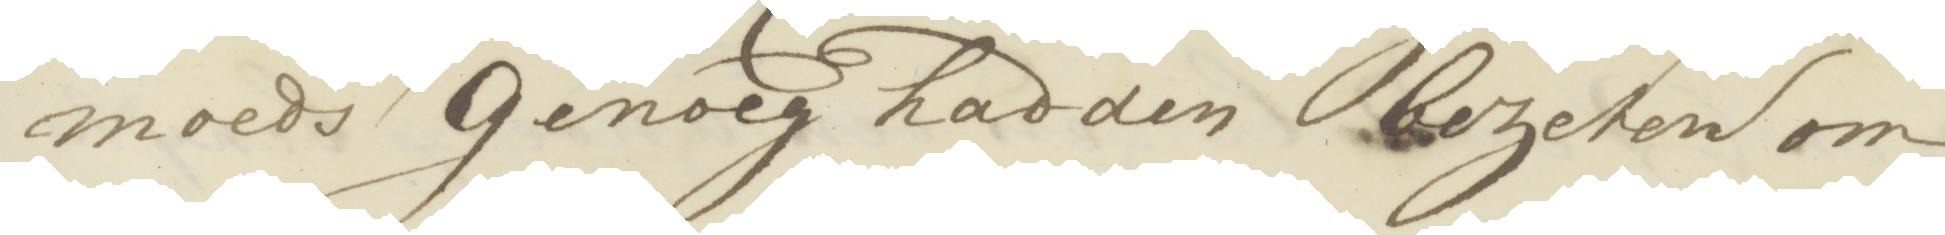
moeds genoeg had den bezeten om
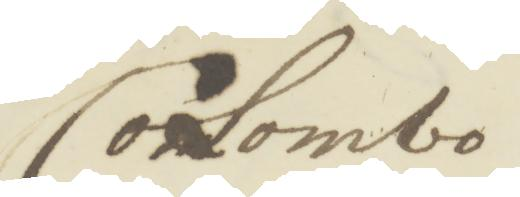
Comlombo
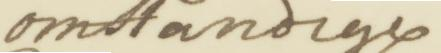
omstandige
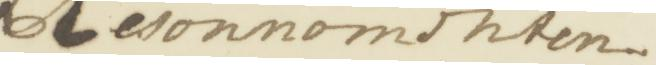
Resonnementen
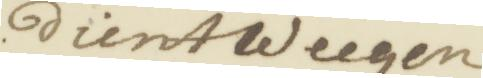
dient weegen
